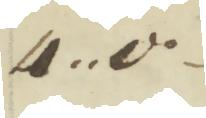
4 „ do
